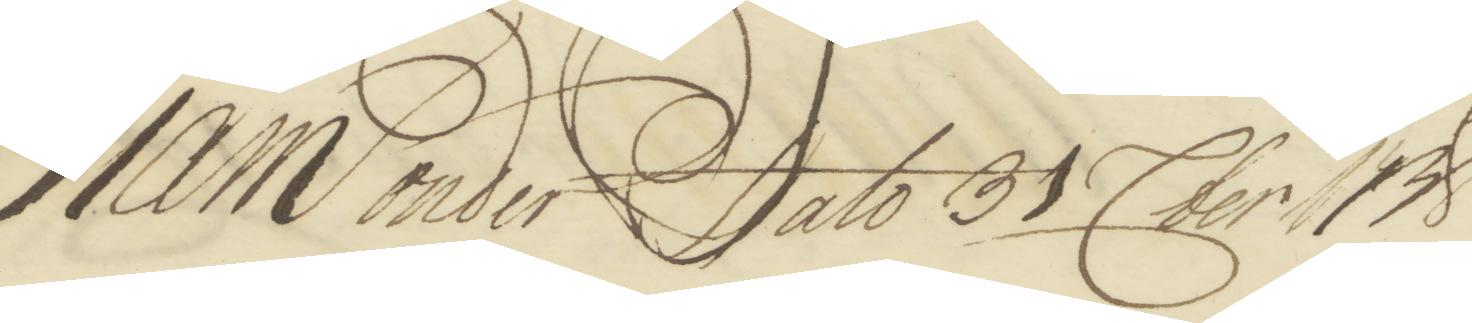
Van Siam onder Dato 31 7ber 1738
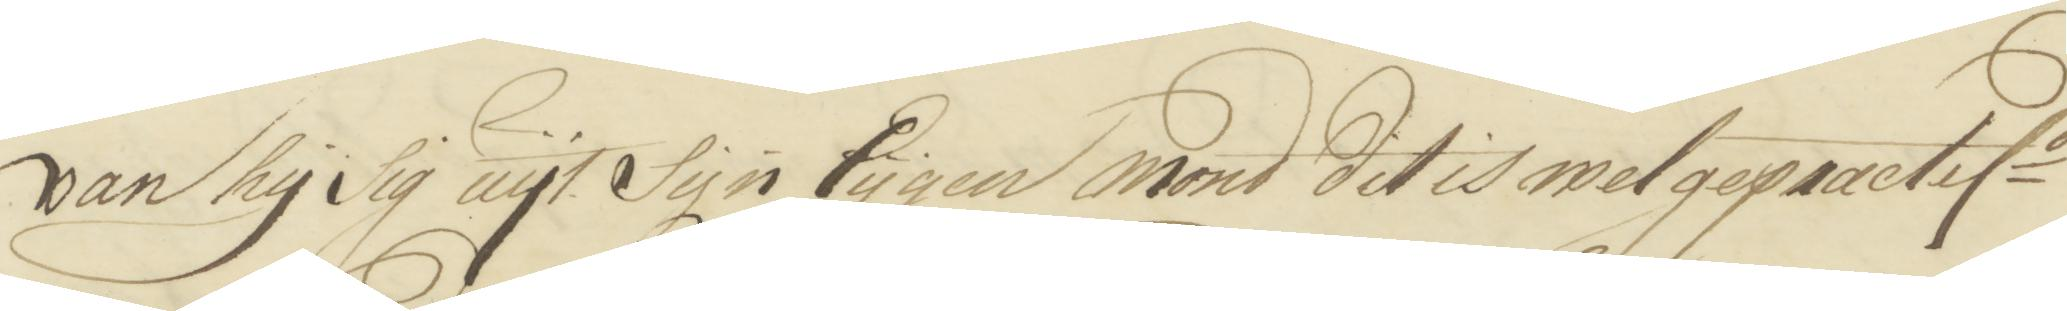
van hij sig uijt sijn Eijgen mond dit is wel gepractis=d
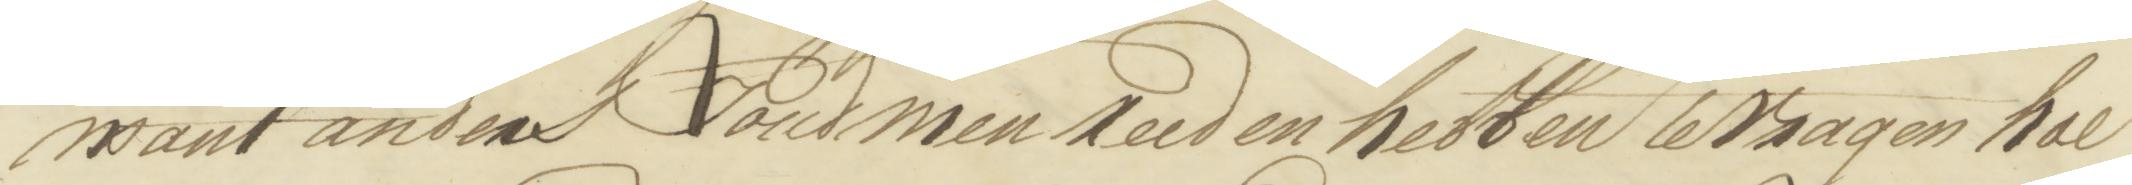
want anders zoud men reeden hebben te vragen hoe
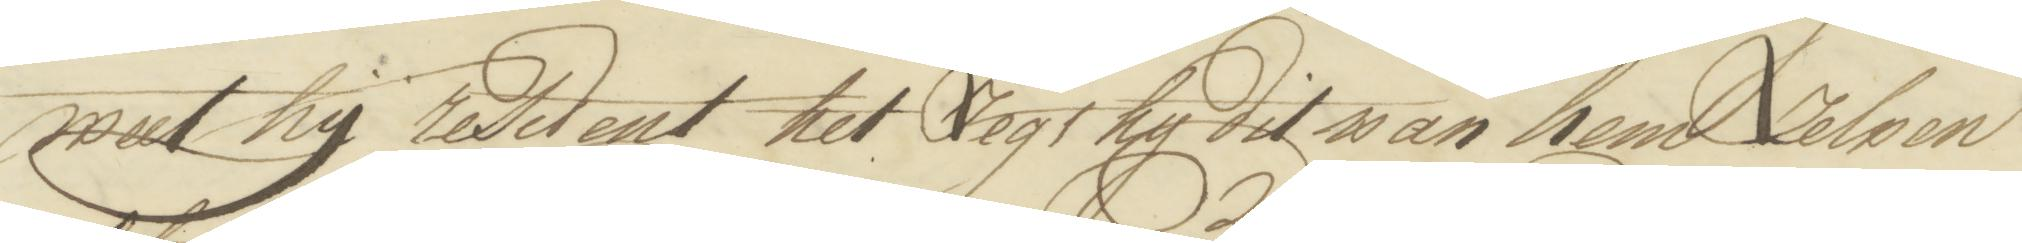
weet hij resident het zegt hy dit van hem zelven
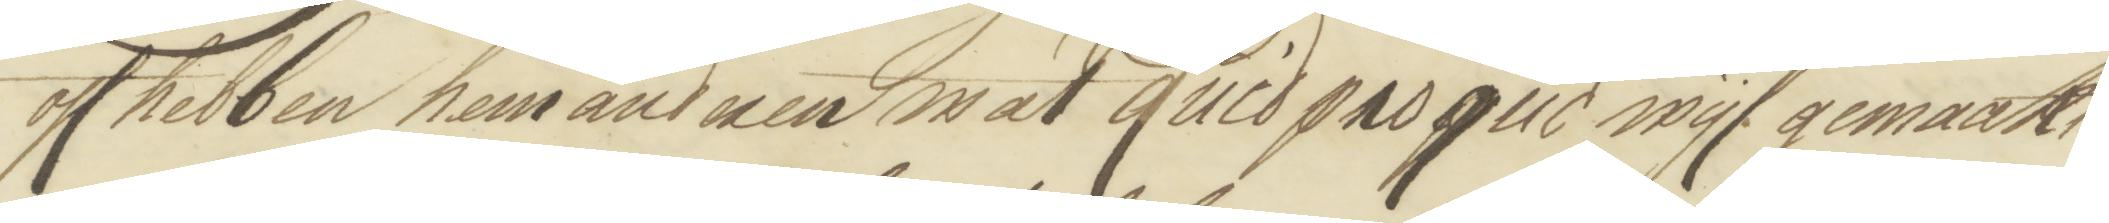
off hebben hem aen wat quid pro que wijs gemaakt
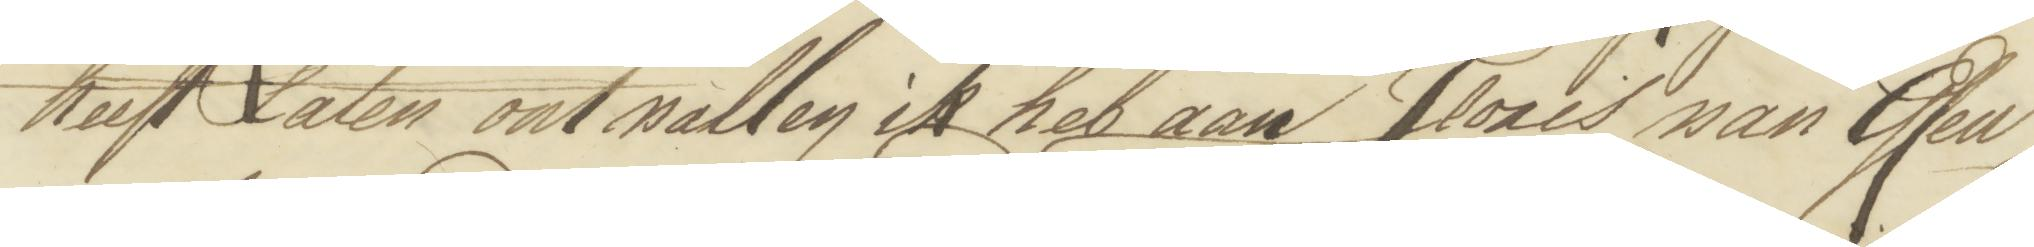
heeft Laten ontvallen ik heb aan Floris van Essen
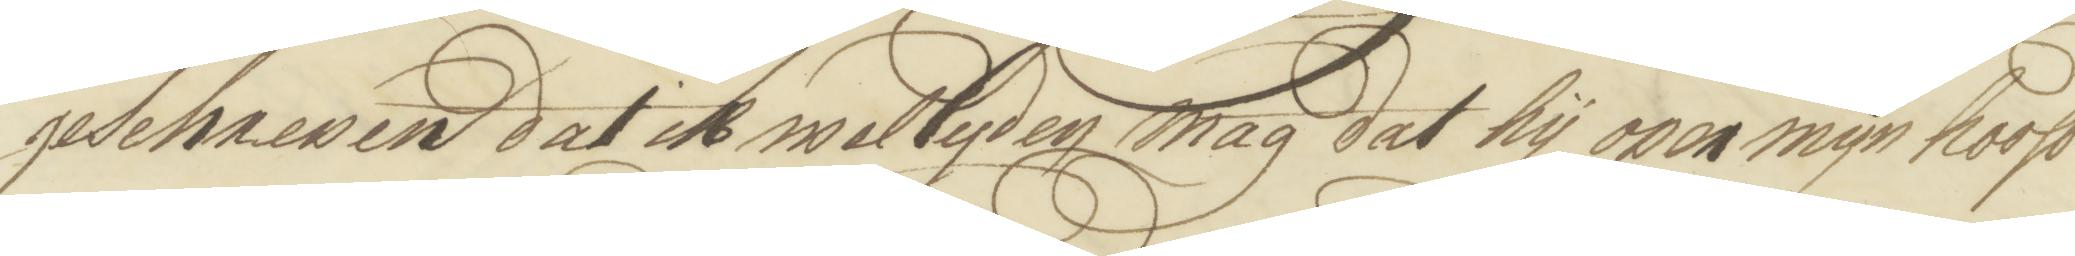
geschreven dat ik wellyden mag dat hij over mijn hoofd
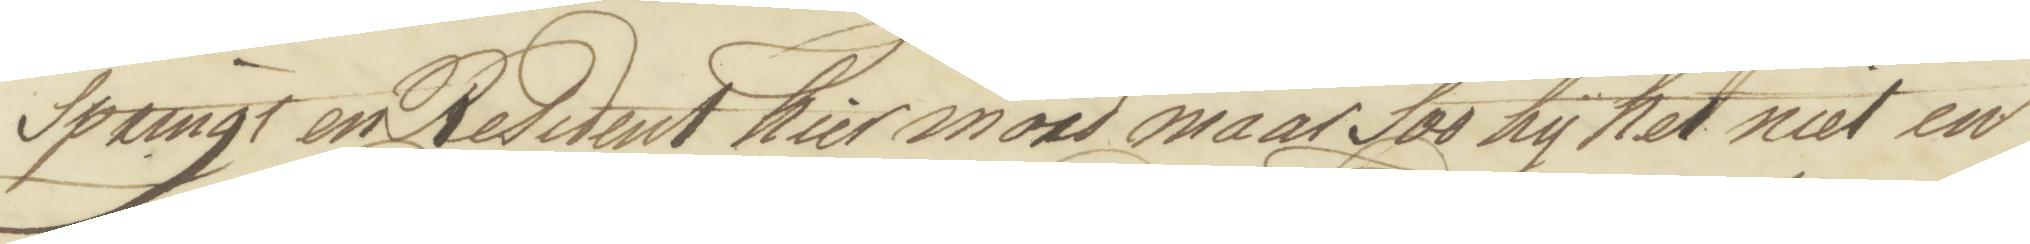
springt en Resident hier word maar soo hij het niet en
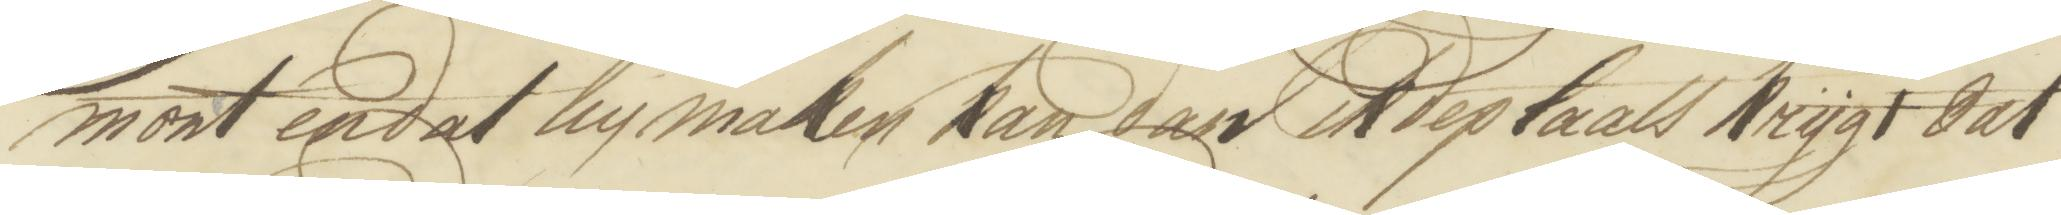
mont en dat hy maken kan dan ik deplaats krijgt dat
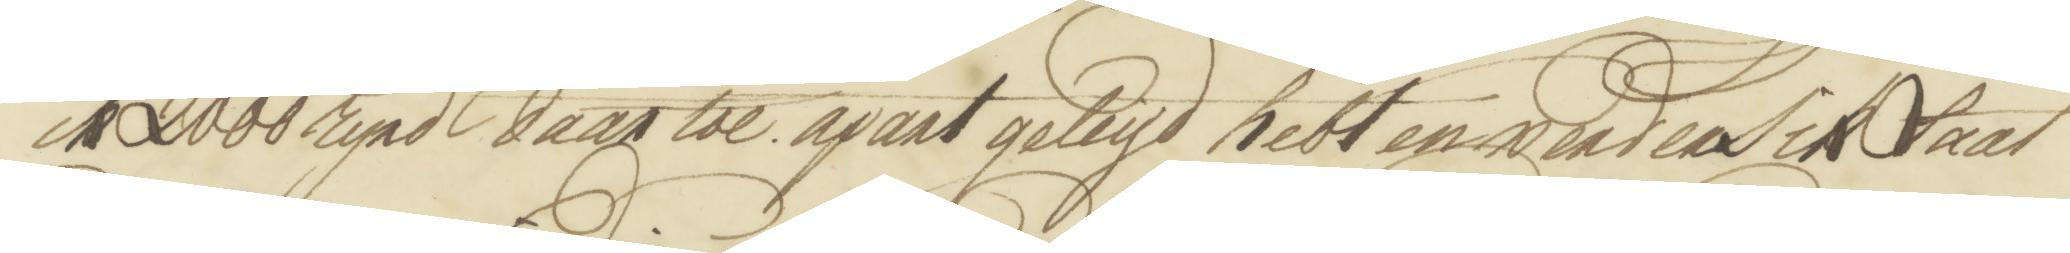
ik 2000 rynd daar toe apart geleijd hebt en werders ik Laat
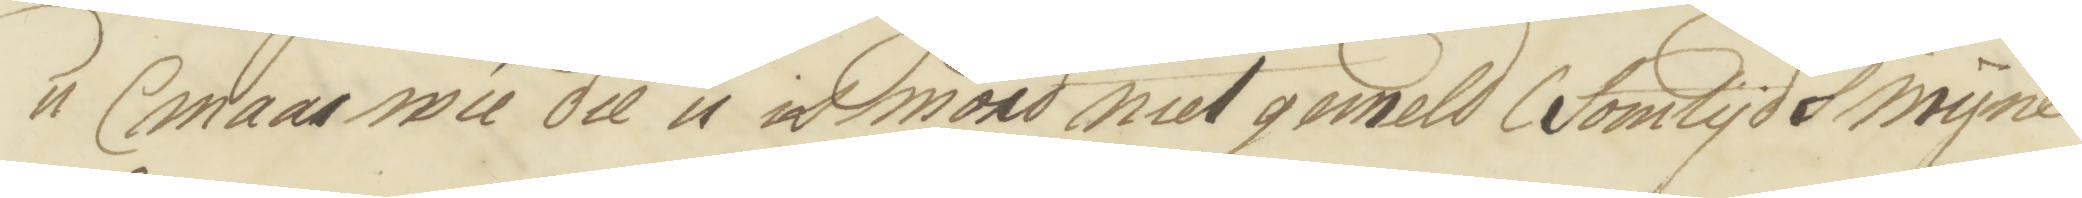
u (maar wie die u is word niet gemeld ( somtijds mijne
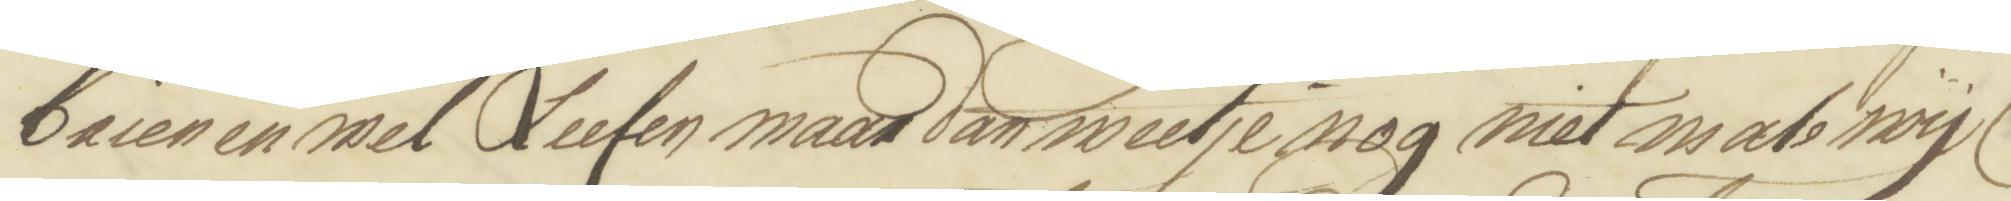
brieven wel Leesen maar dan weet je nog niet wat wij (
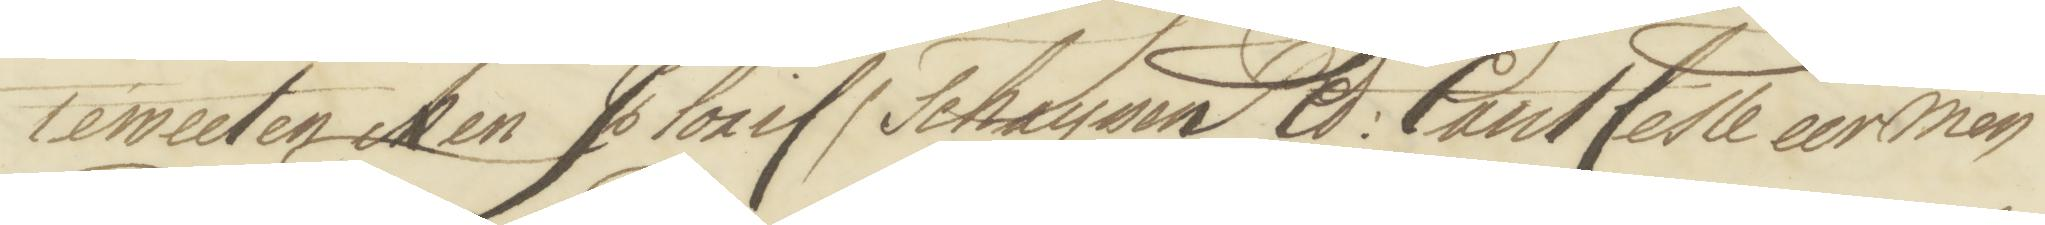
teweeten ik en Floris / schryven Ed: Erntfeste eer men
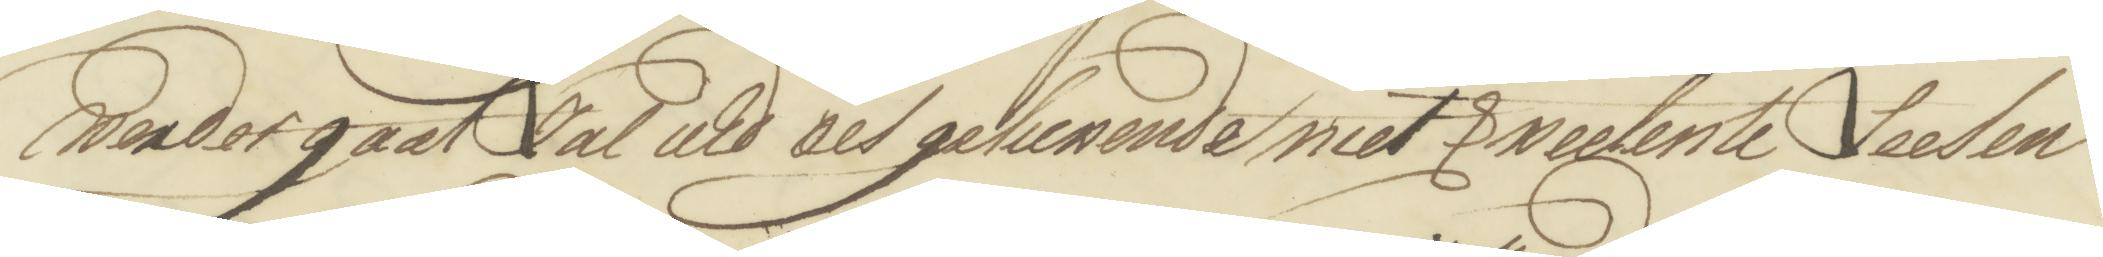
werder gaat zal uEd des gelievende niet verveelen te Leesen
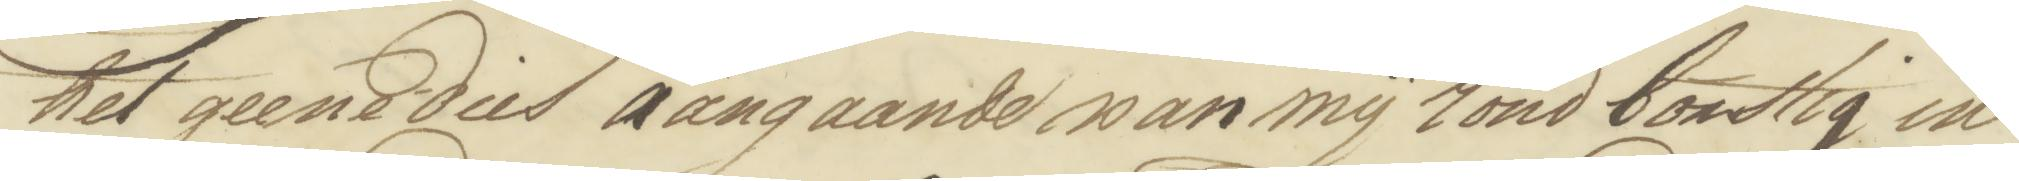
het geene dies aangaande van mij rond borstig in
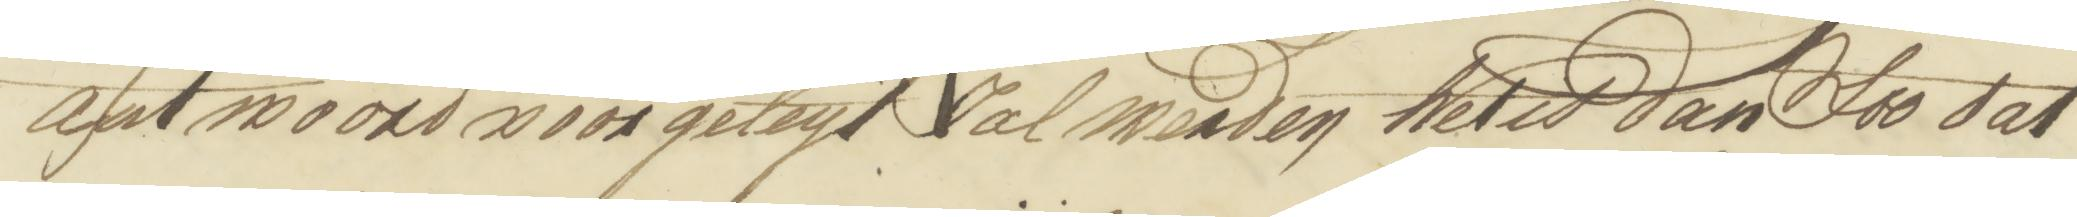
antwoord voorgeleijt zal werden het is dan Soo dat
